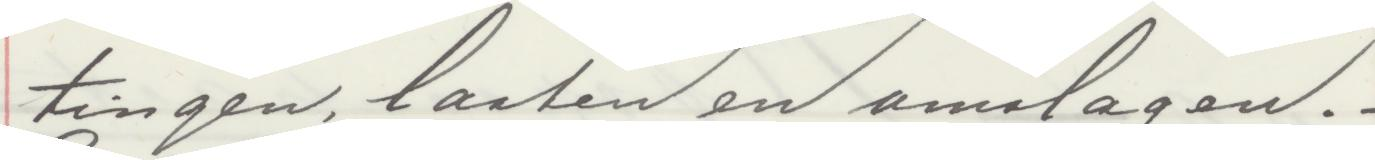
tingen, lasten en armslagen.
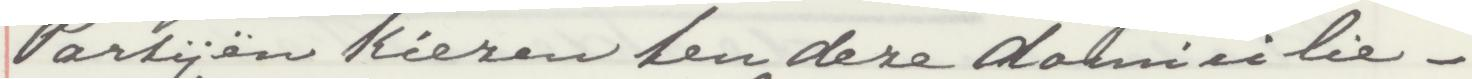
Partijën kiezen ten deze domicilie –
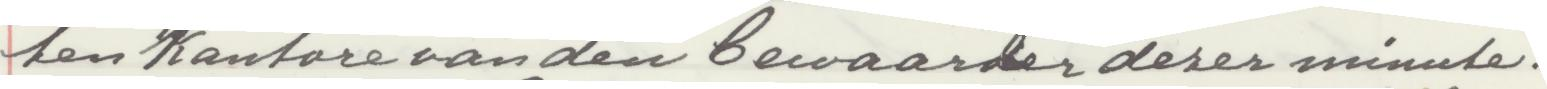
ten kantore van den bewaarder dezer minute.
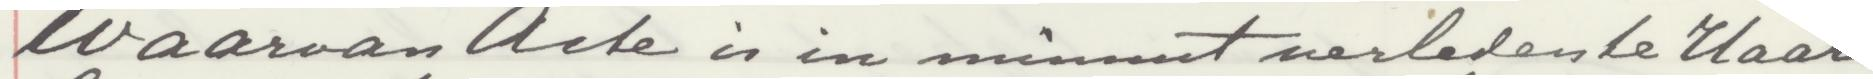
Waarvan Acte is in minuut verleden te Haar
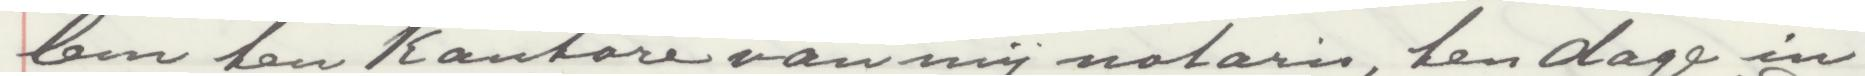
lem ten kantore van mij notaris, ten dage in
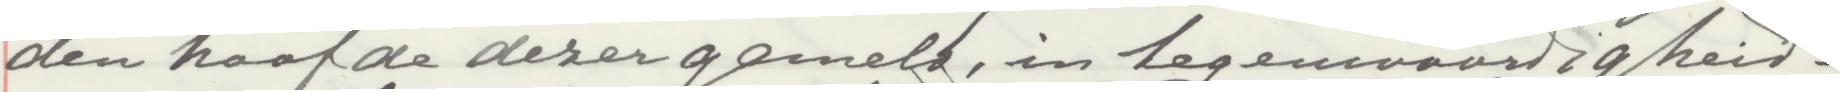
den hoofde dezer gemeld, in tegenwoordigheid –
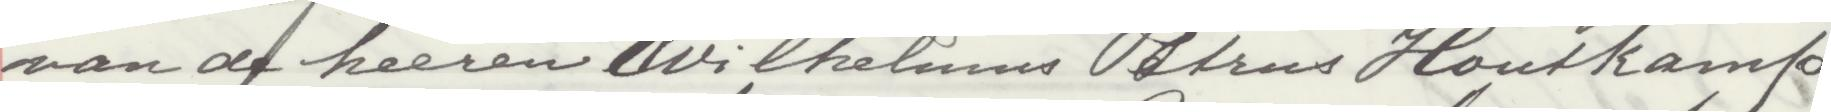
van de heeren Wilhelmus Petrus Houtkamp
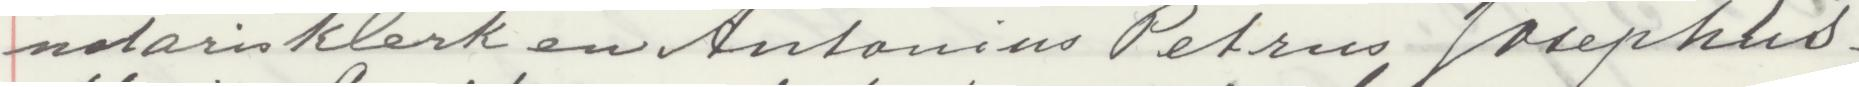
notaris klerk en Antonius Petrus Josephus
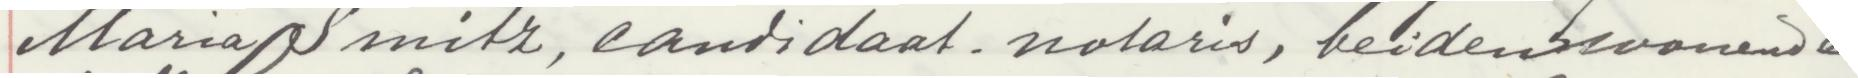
Maria Smitz, candidaat - notaris, beiden wonende
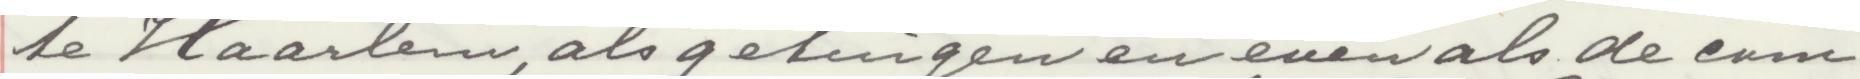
te Haarlem, als getuigen en even als de com
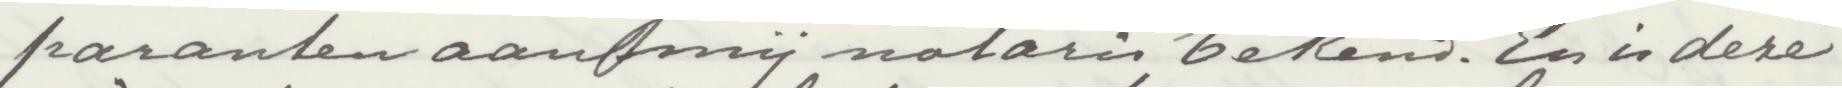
paranten aan mij notaris bekend. En is deze
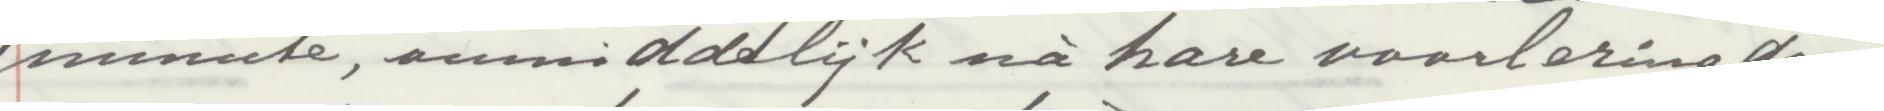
minute, onmiddelijk na hare voorlezing door
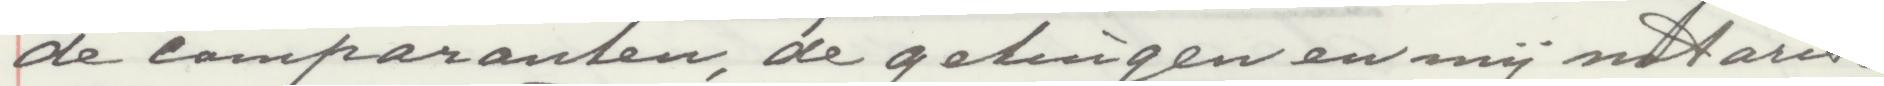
de comparanten, de getuigen en mij notaris -
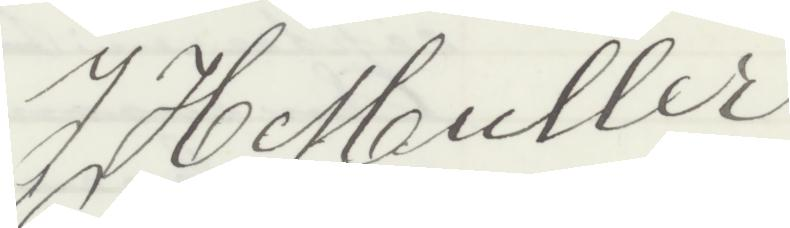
I H Mulller
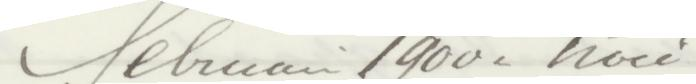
februari 1900 en twee
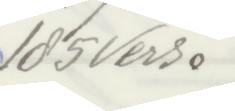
185 verso
